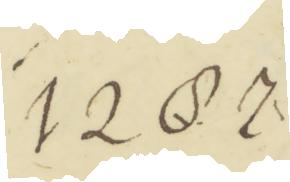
1287.
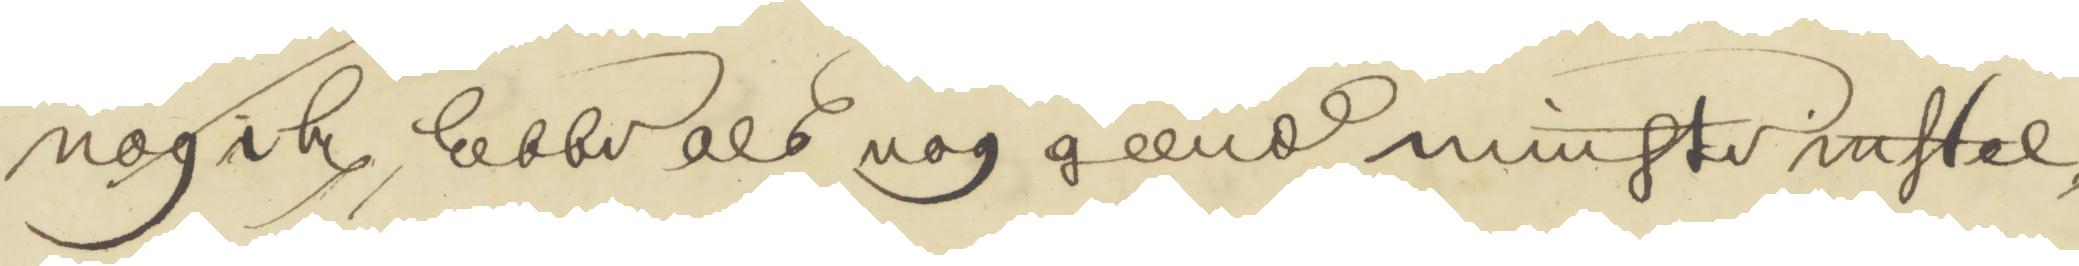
nog ik, hebbe als nog geende minste instel„
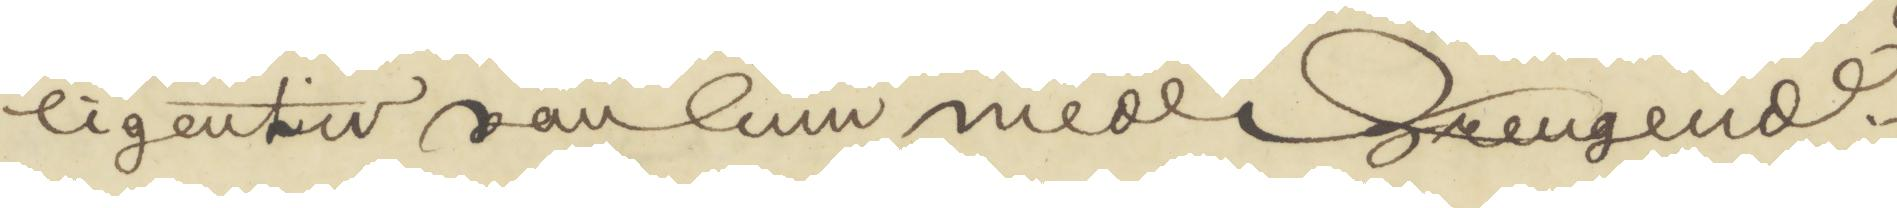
ligentie van hun mede Brengende
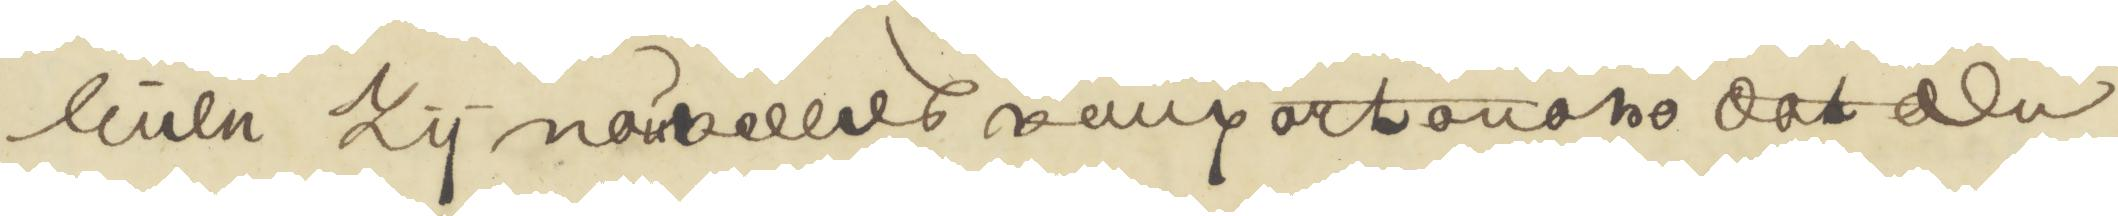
hier zij nouvelles van portonovo dat den
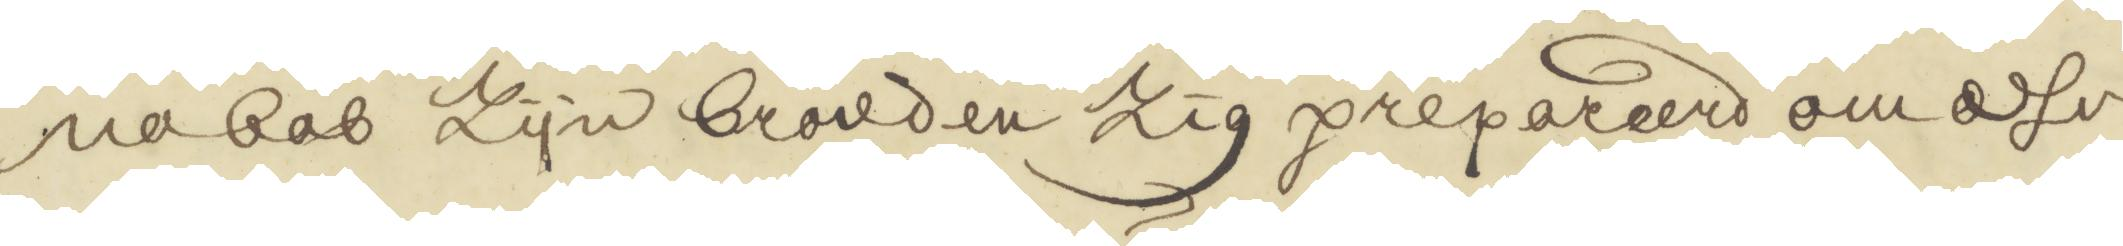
nabab zijn broeder zig prepareerd om dese
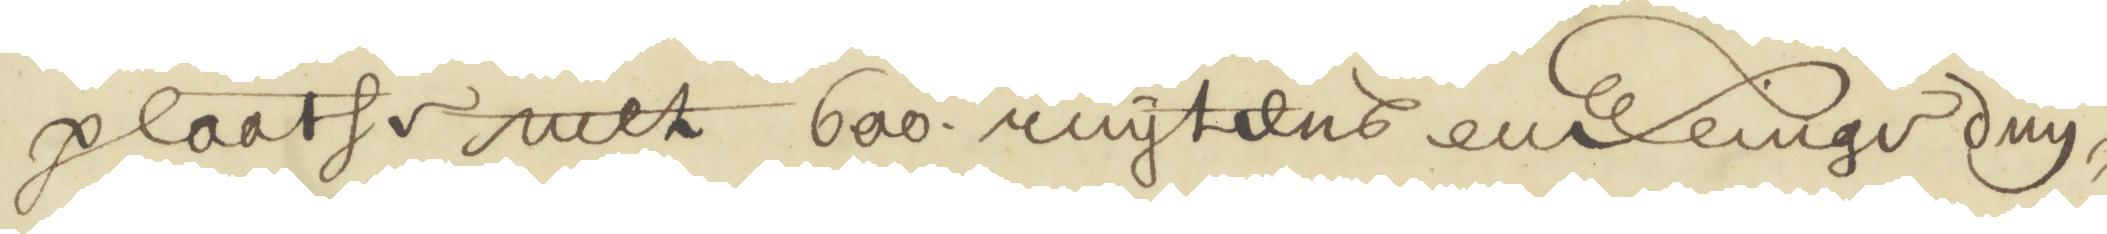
plaatse met 600. ruijters en Eenige duij„
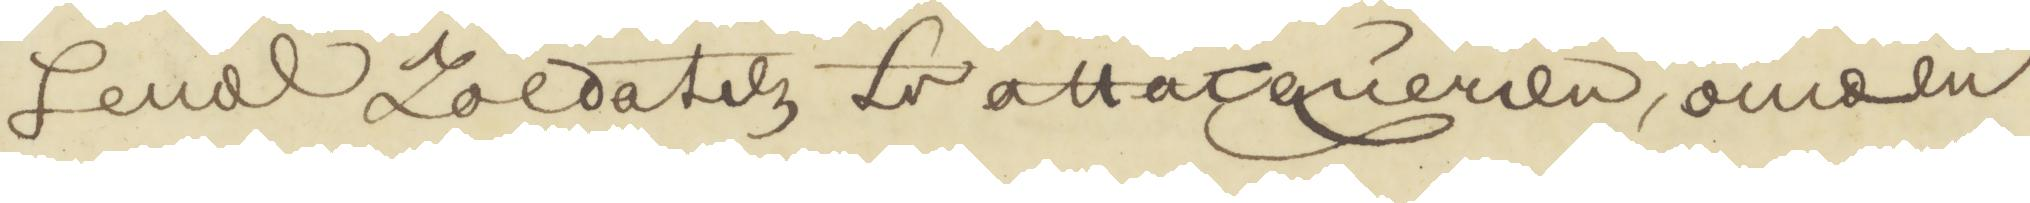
sende zoldaten te attacqueren, om den
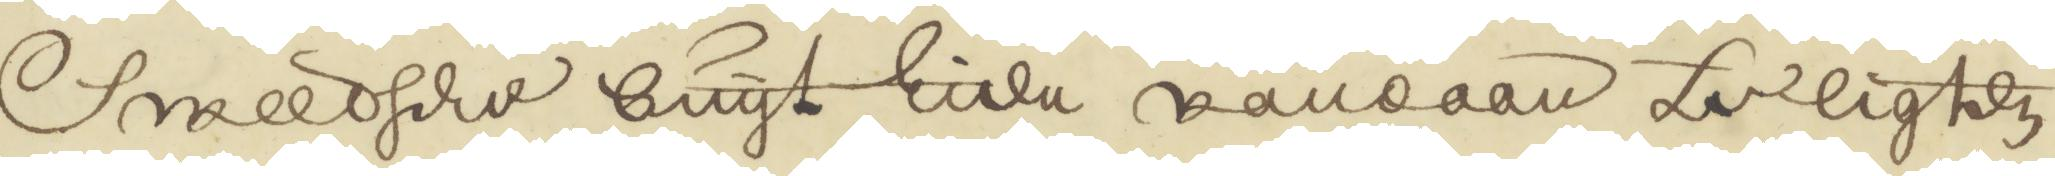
sweedsche buijt hier vandaan te ligten
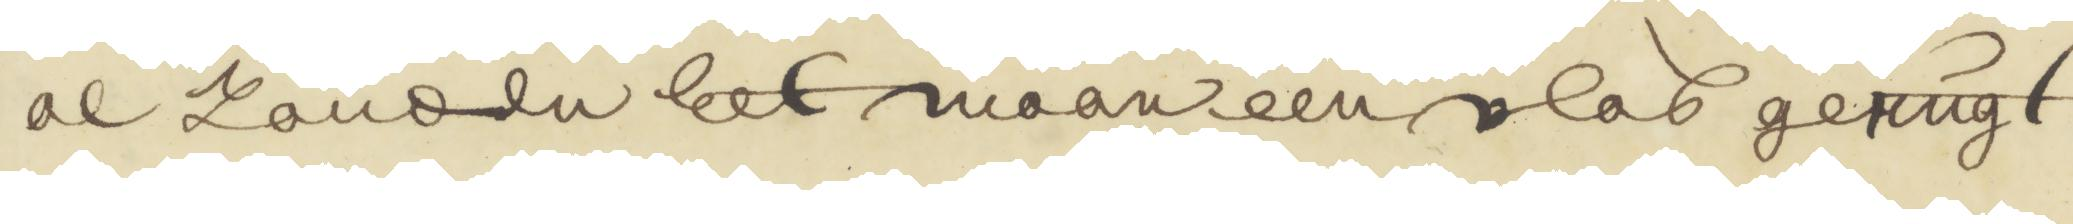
al zouden het maar een vlas gerugt
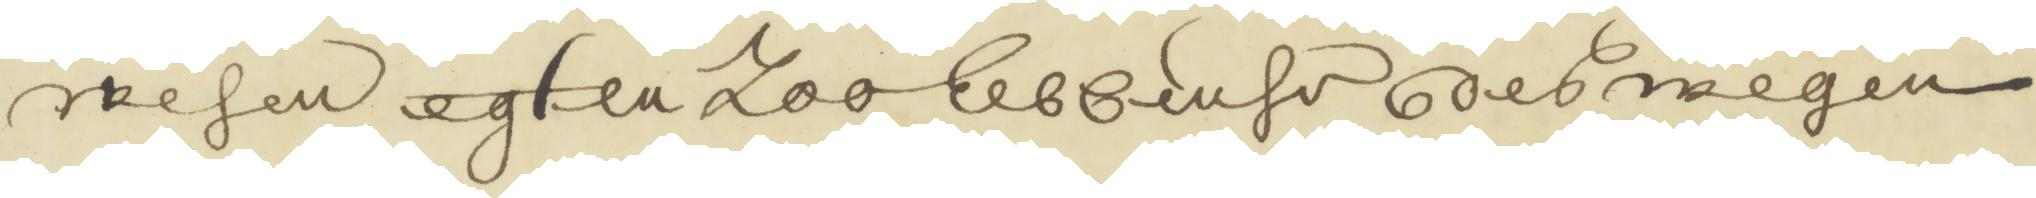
wesen egter zoo hebbense deswegen
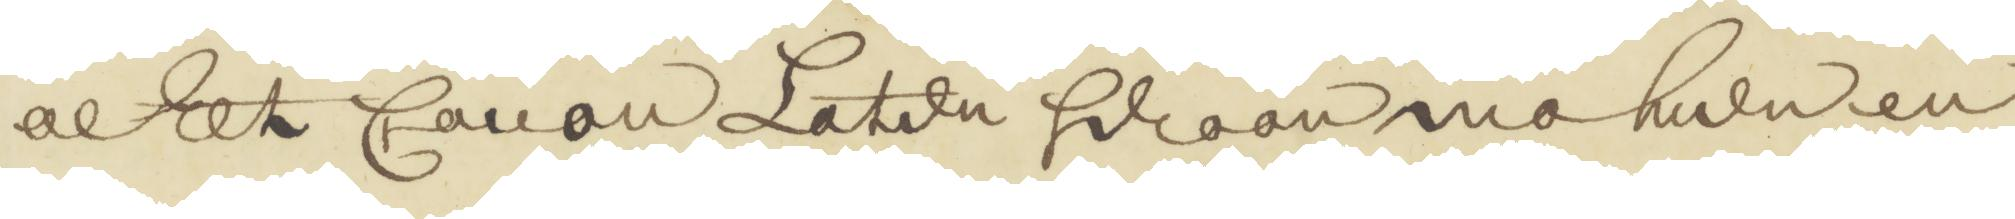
al het Canon Laten schoon maken en
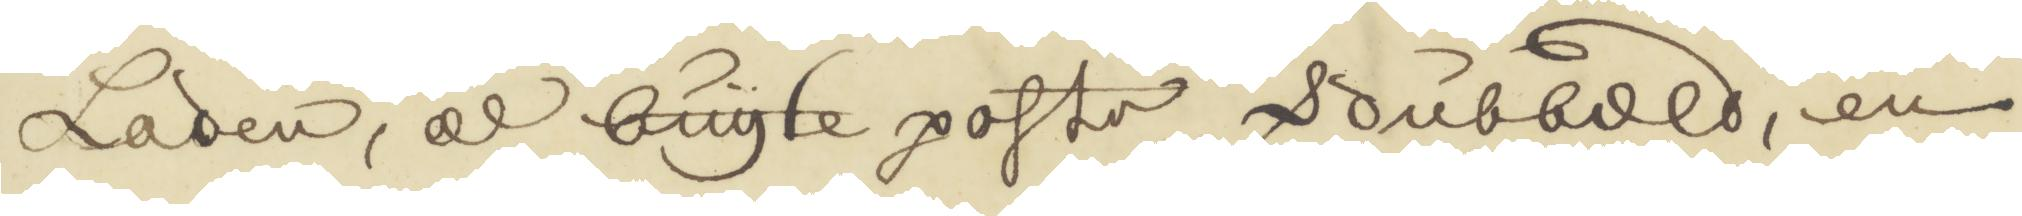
Laden, de buijte poste verdubbeld, en
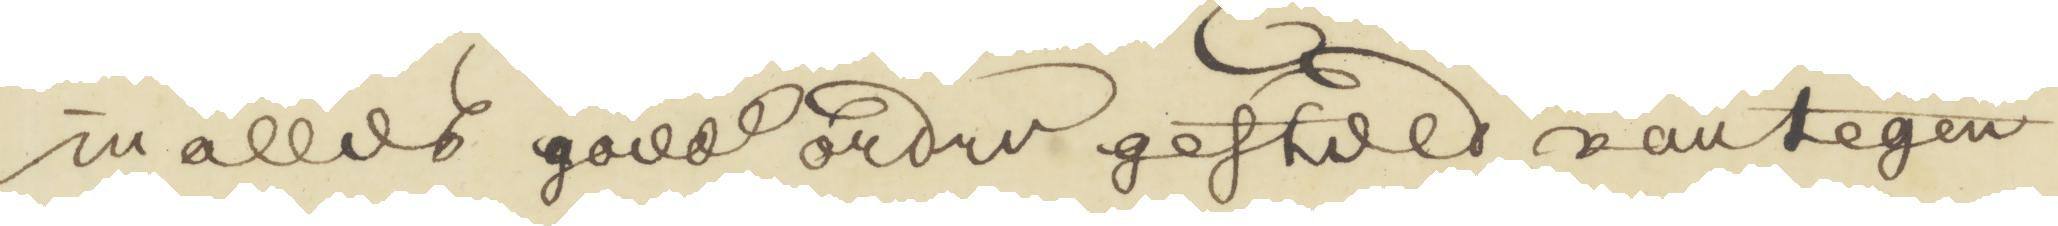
in alles goede ordre gesteld van tegen
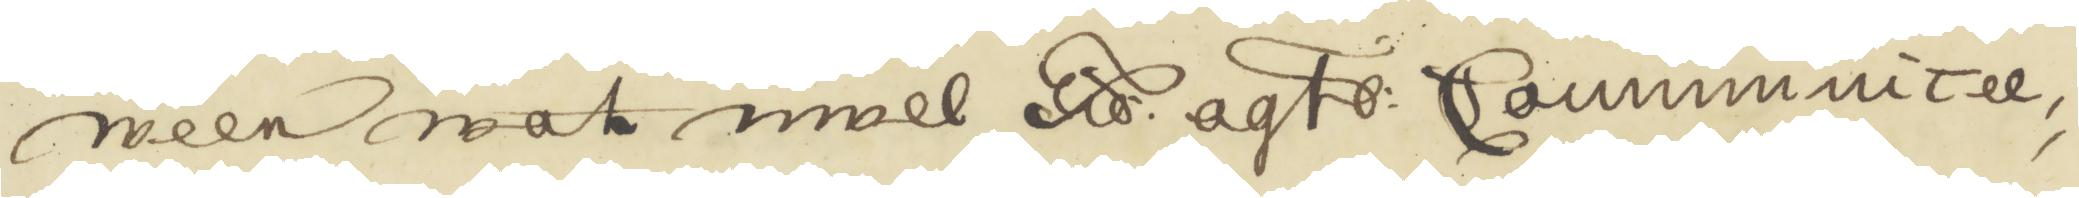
weer wat uwel Ed: agtb: Communicee„
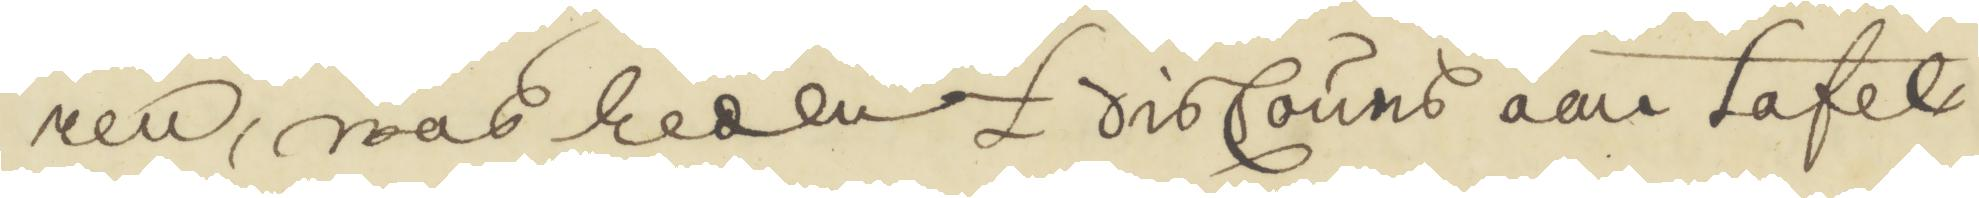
ren, was heden 't discours aan tafel
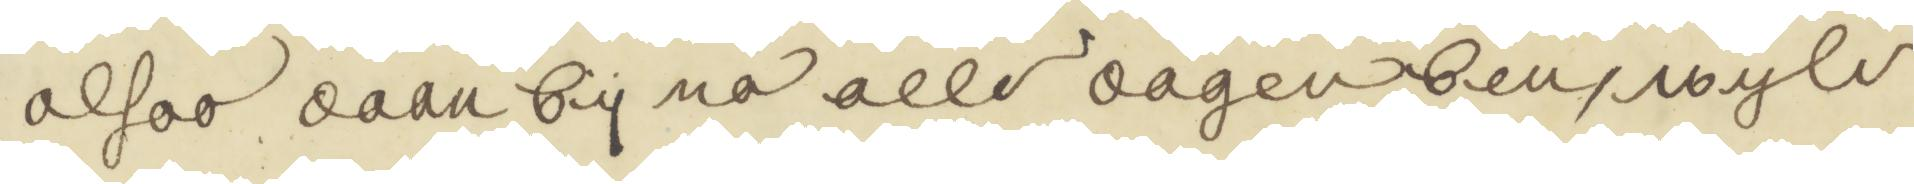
alsoo daar bij na alle dagen ben, wijle
